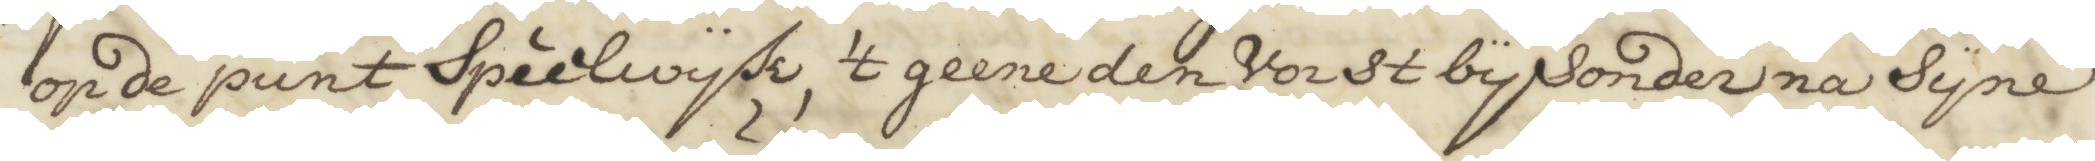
op de punt speelwijk, ’t geene den vorst bijsonder na sijne
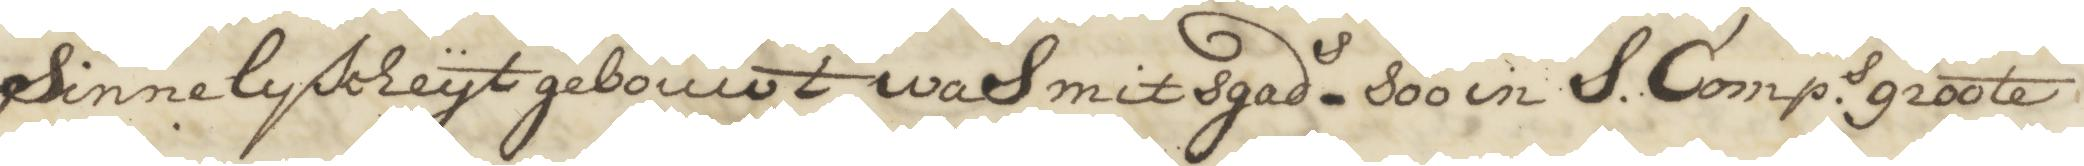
sinnelykheijt gebouwt was mitsgad_s soo in S.Comp.s groote
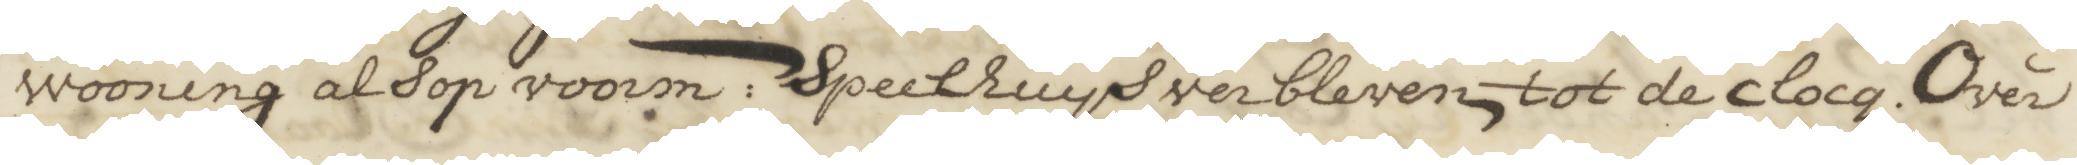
wooning alsop voorm: speelhuijs verbleven tot de clocq. Over'
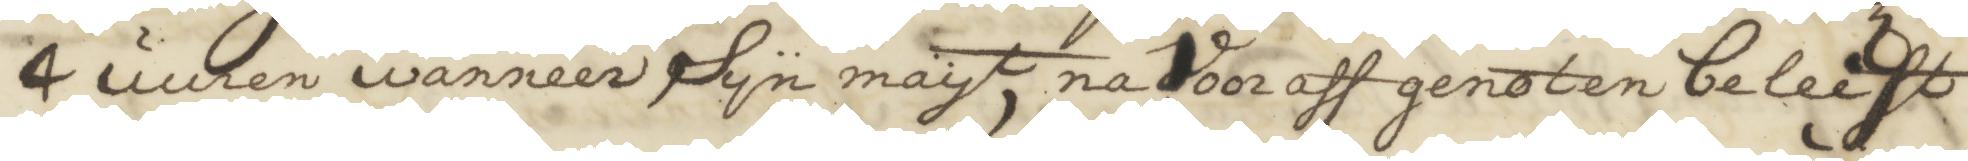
4 uuren wanneer sijn maijt, na Voor aff genoten beleeft
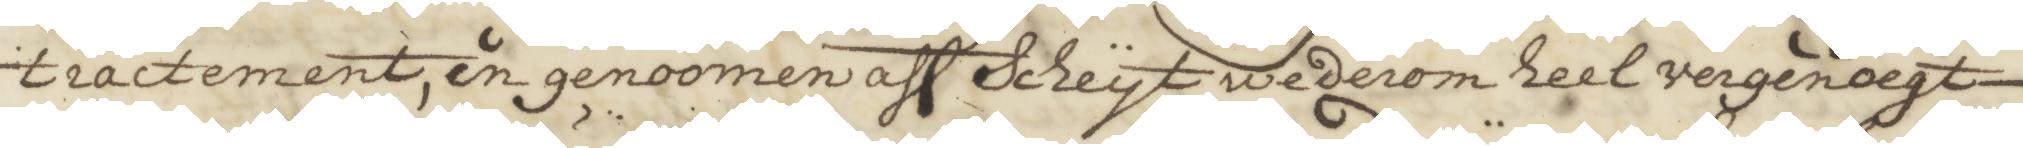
tractement, en genoomen affscheijt wederom heel vergenoegt
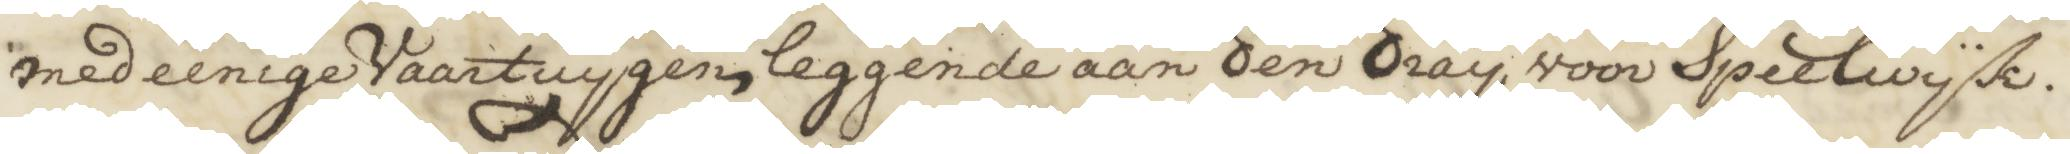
med eenige Vaartuijgen leggende aan den draij voor speelwijk.
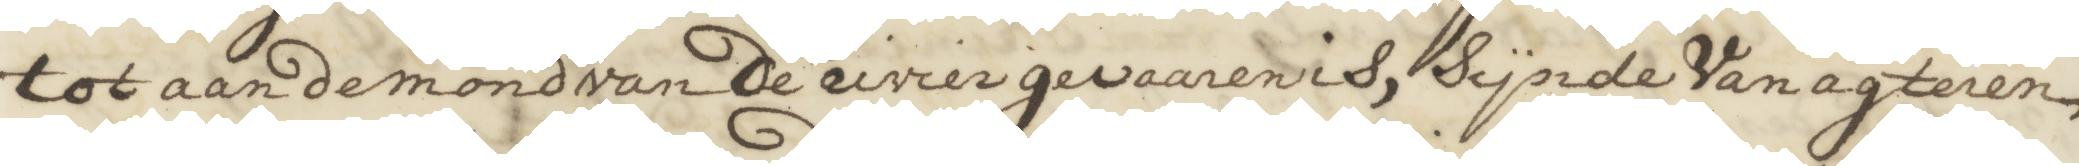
tot aan demond van de rivier gevaaren is, sijnde Van agteren
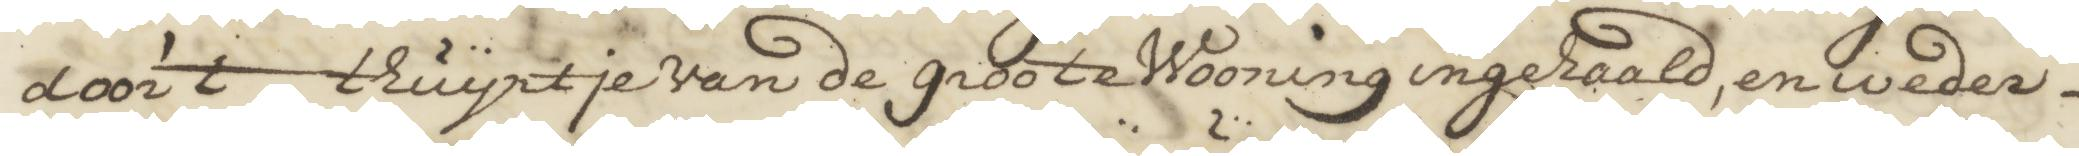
door’t thuijntje van de groote Wooning ingehaald, en weder _
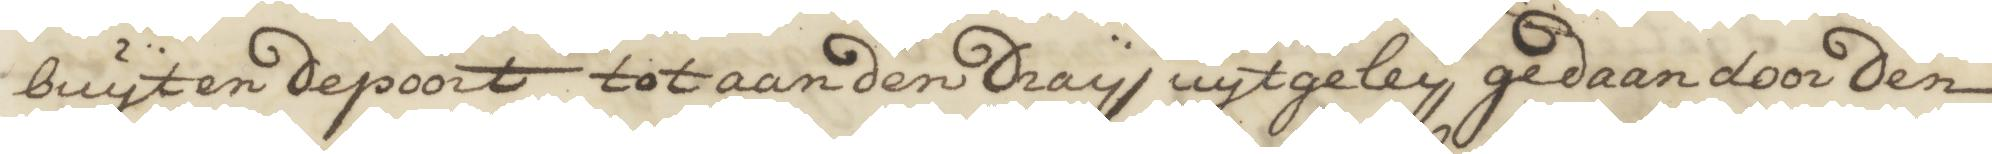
buijten depoort tot aan den draij uijtgeley gedaan door den
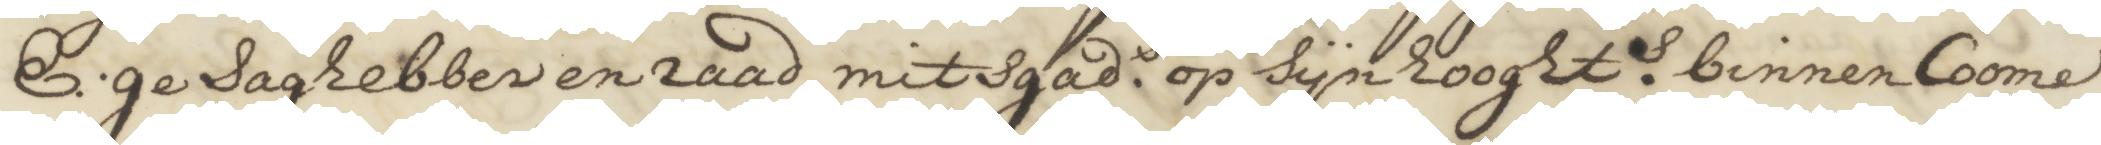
E: gesaghebber en raad, mitsgad.s op sijn hooght.s binnen Coome
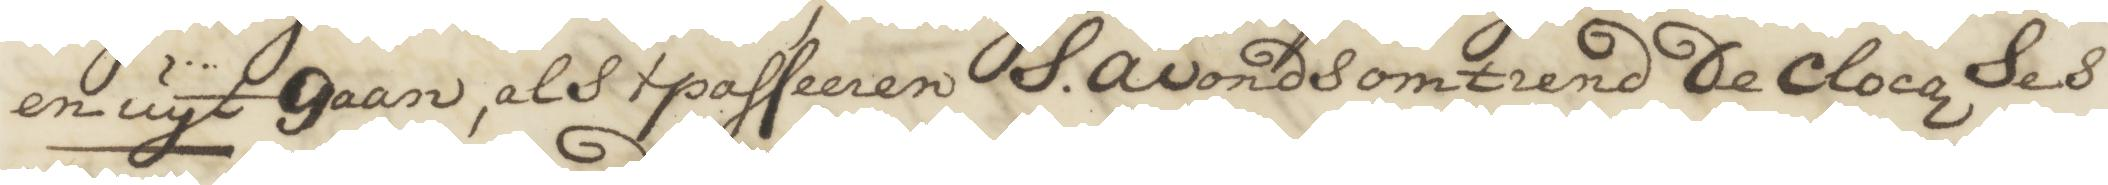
en uijt Gaan, als tpasseeren s.avonds omtrend de clocq ses
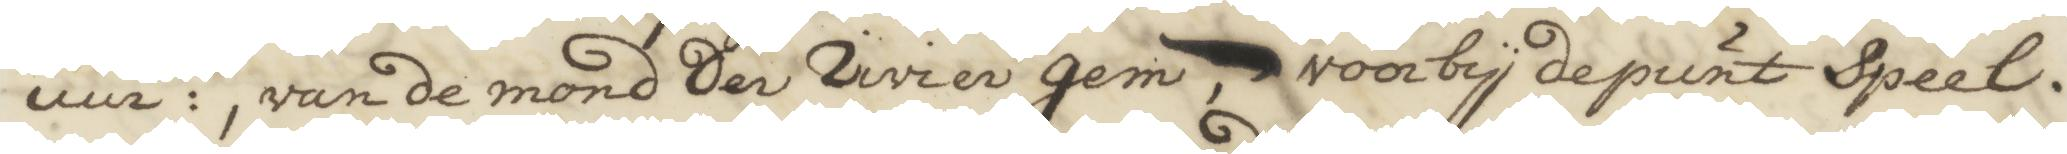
uur:, van de mond der rivier gem,- voorbij depunt speel.
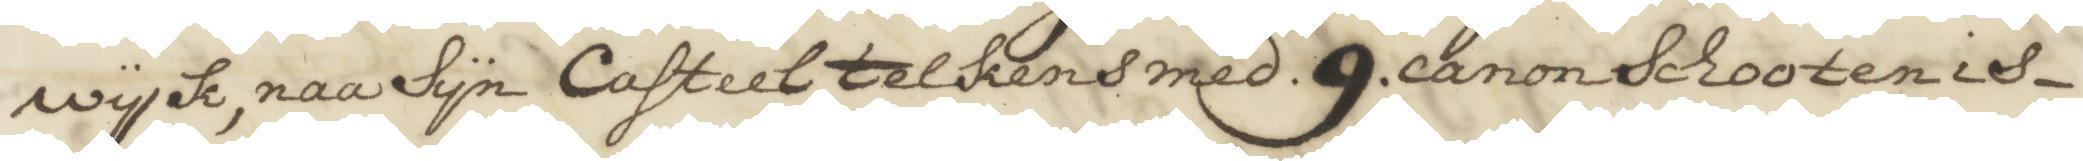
wijk, naa sijn Casteel telkens med. 9. canon schooten is
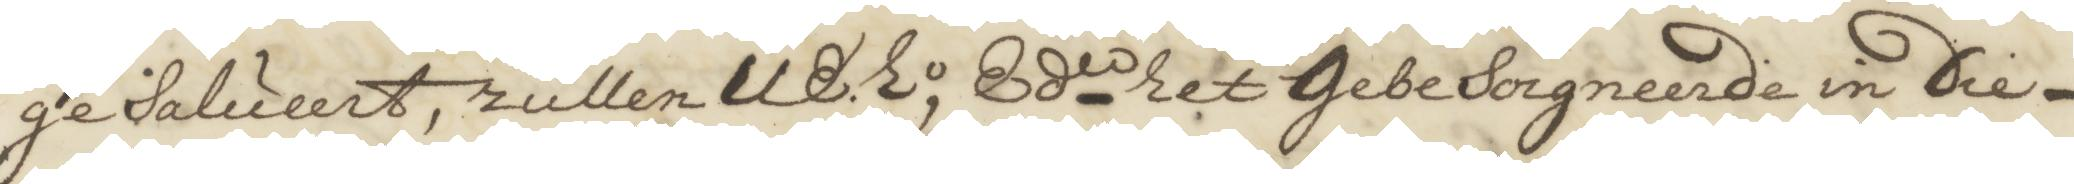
gesalueert, zullen UE. h‚o Ed_en het Gebesoigneerde in die _
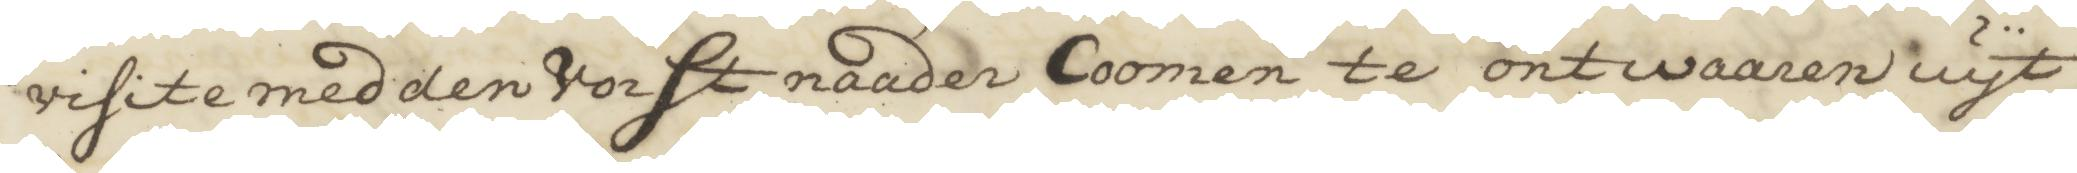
visite med den vorst naader Coomen te ontwaaren uijt
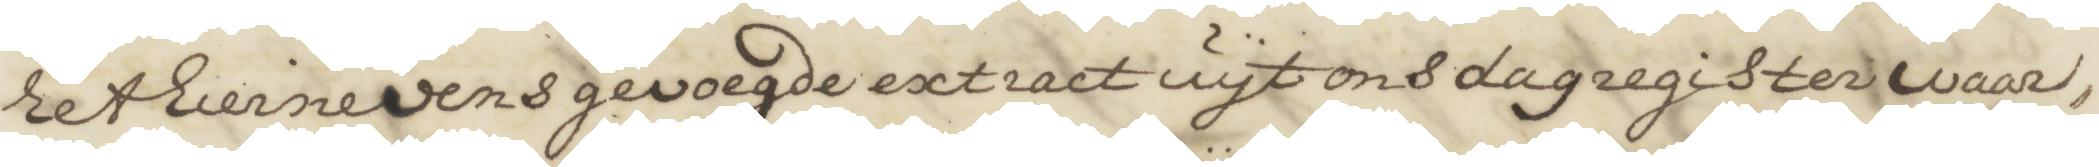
het hiernevens gevoegde extract uijt ons dagregister waar„
